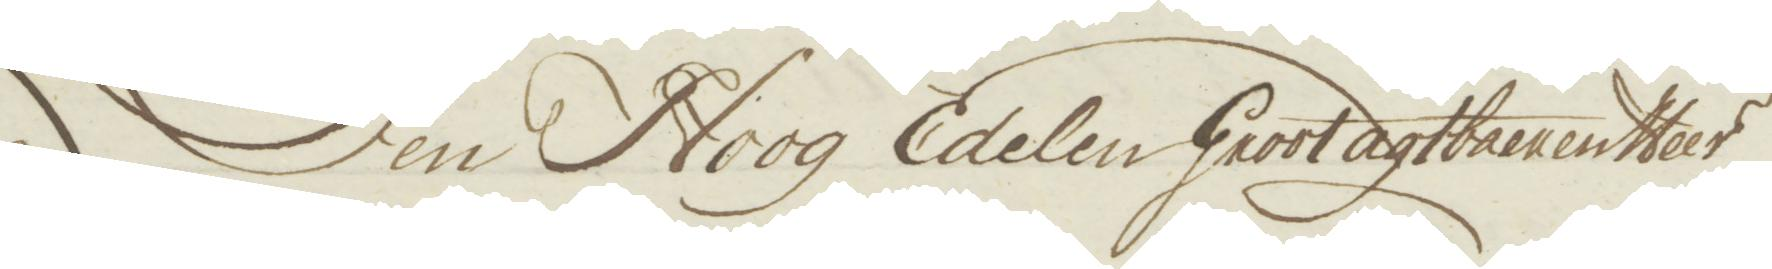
Den Hoog Edelen Groot agtbaeren Heer
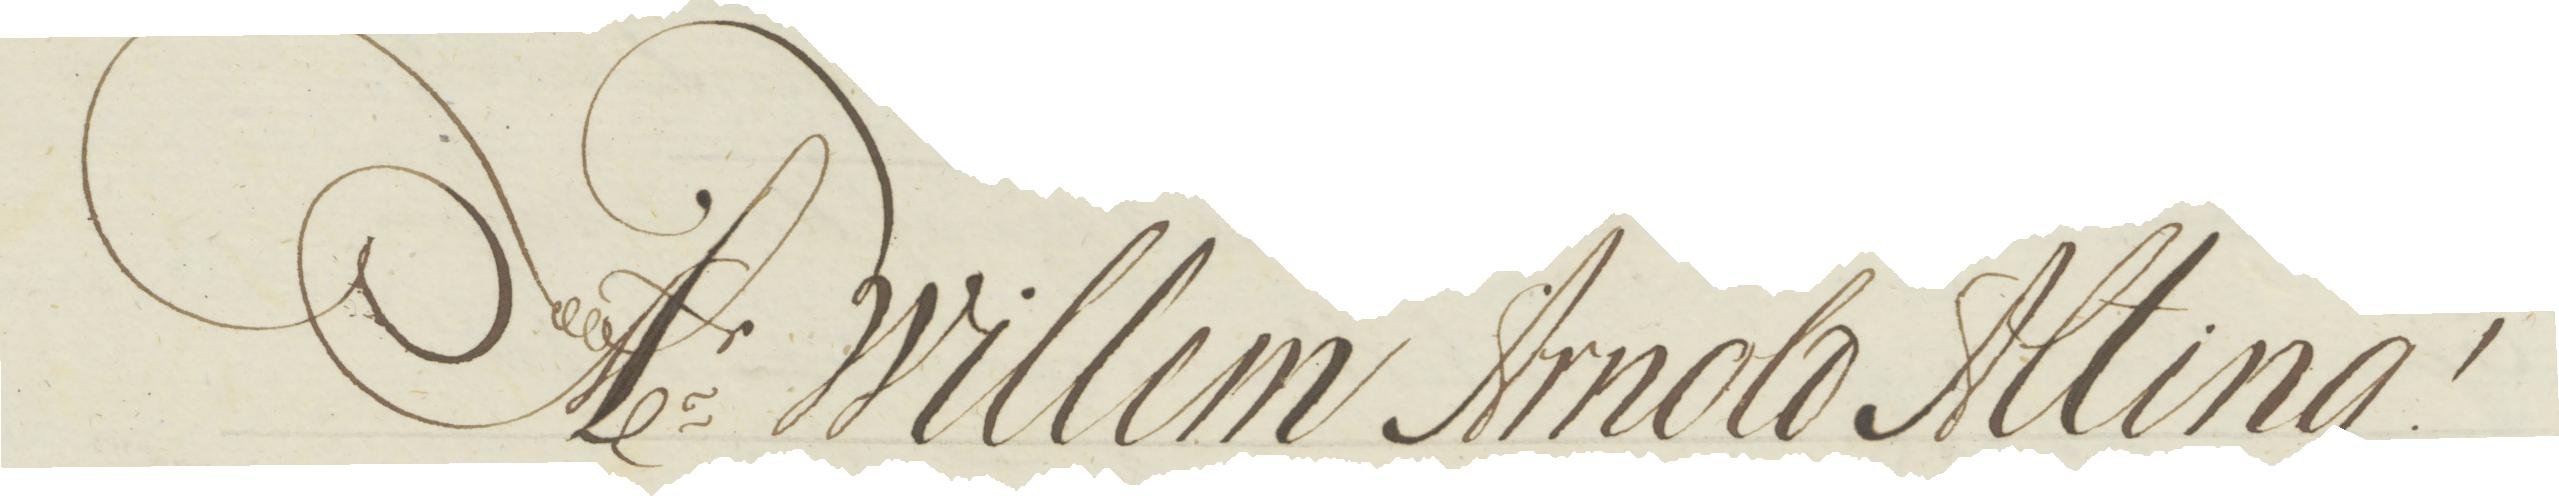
M=r Willem Arnold Alting!
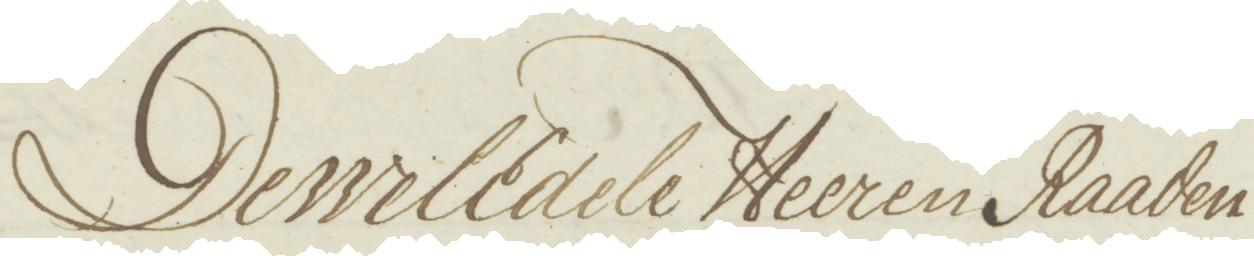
De wel Edele Heeren Raaden
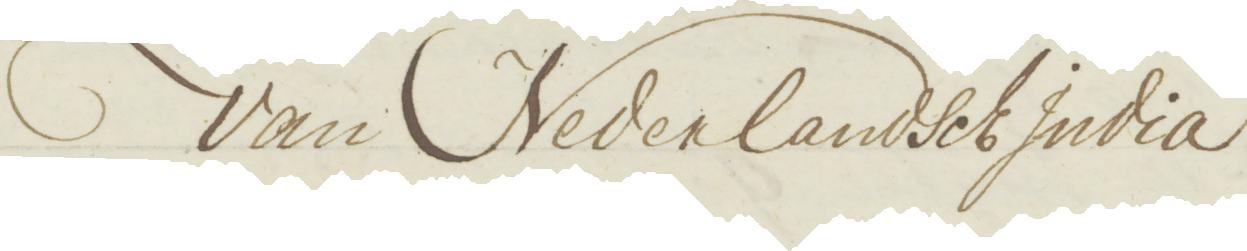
van Nederlandsch jndia
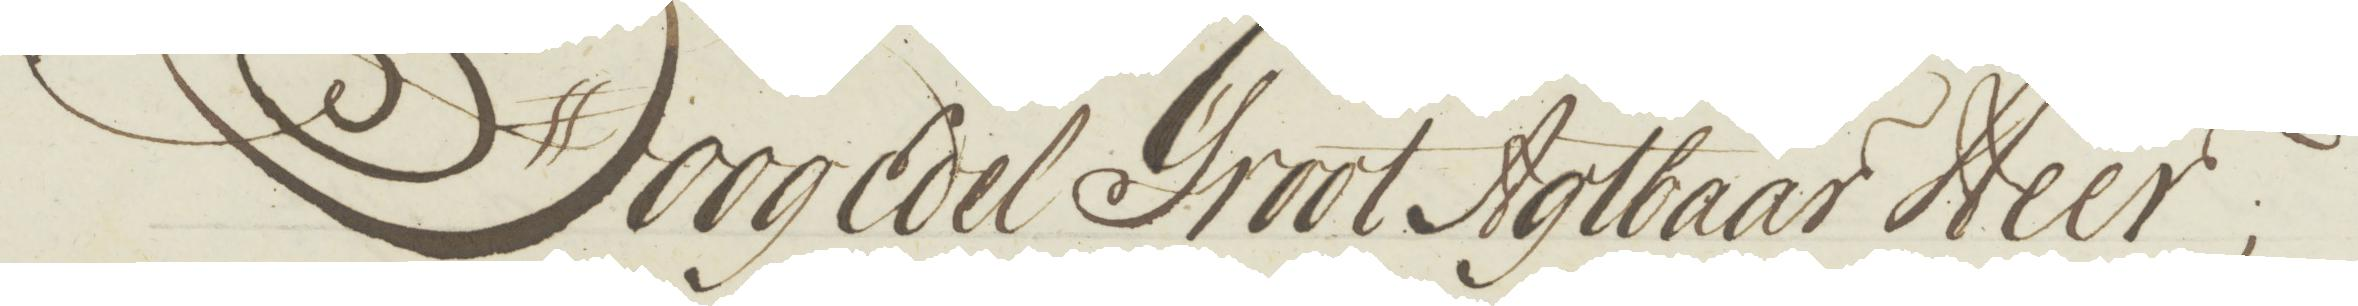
Hoog Edel Groot Agtbaar Heer;
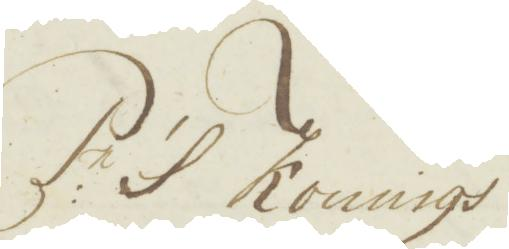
P:r 'S Konings
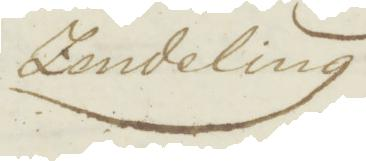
zendeling
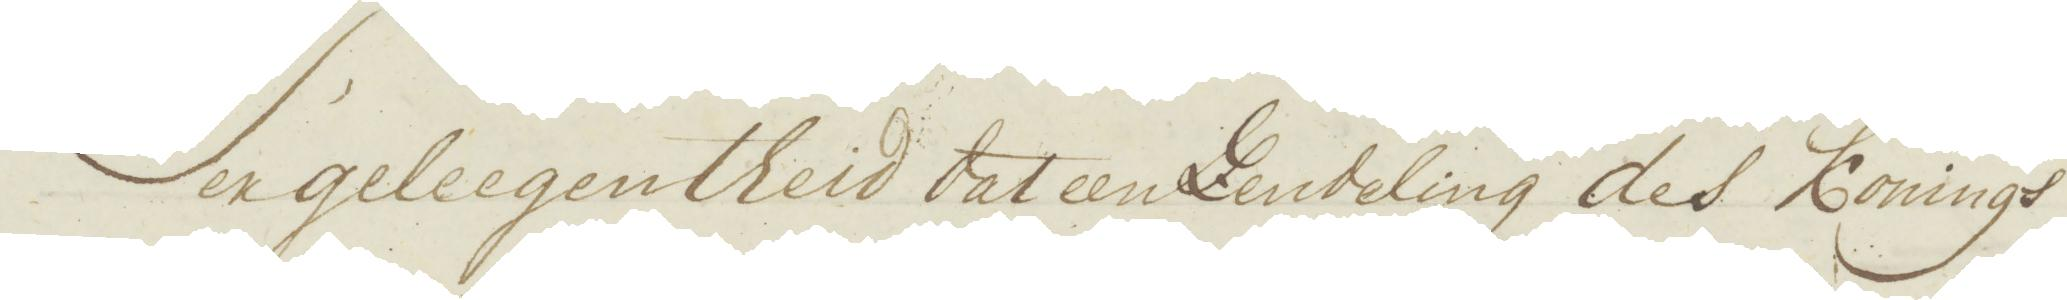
Ter geleegentheid dat een zendeling des konings
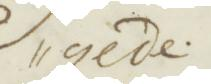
„gede
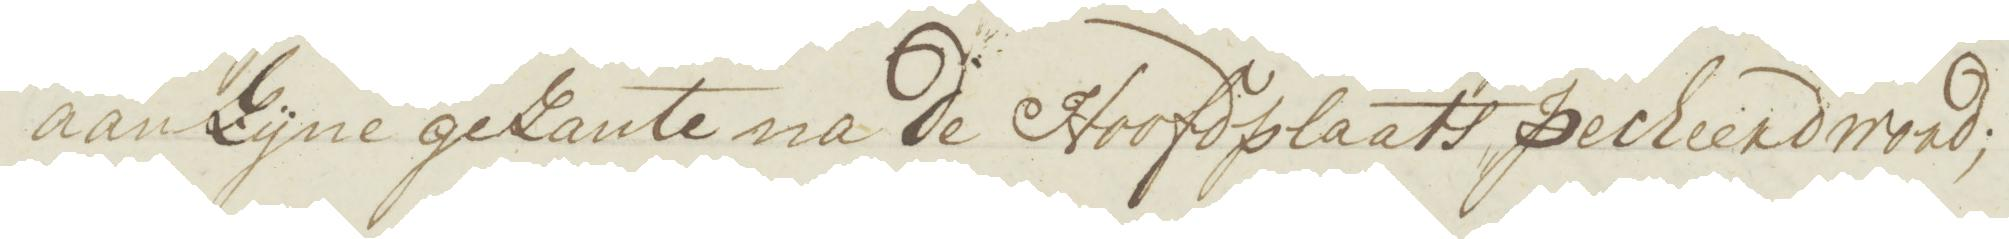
aan zijne gezante na de Hoofdplaats „pecheerd word;
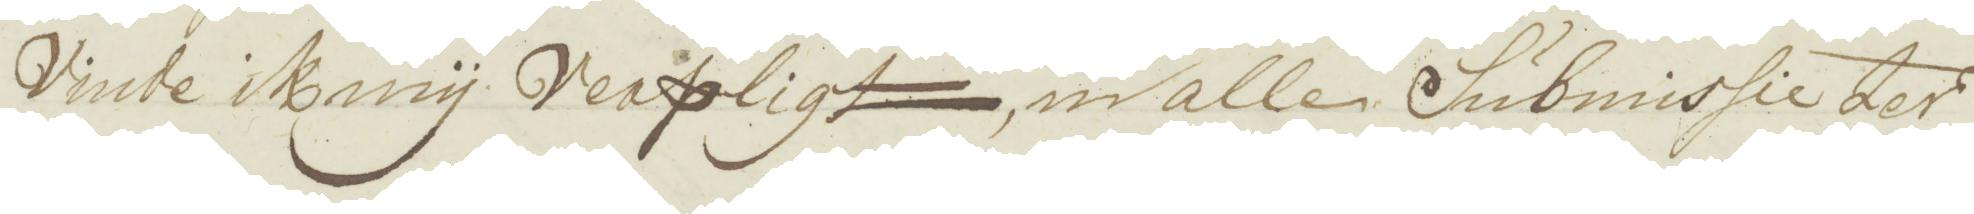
vinde ik mij verpligt, in alle submissie ter
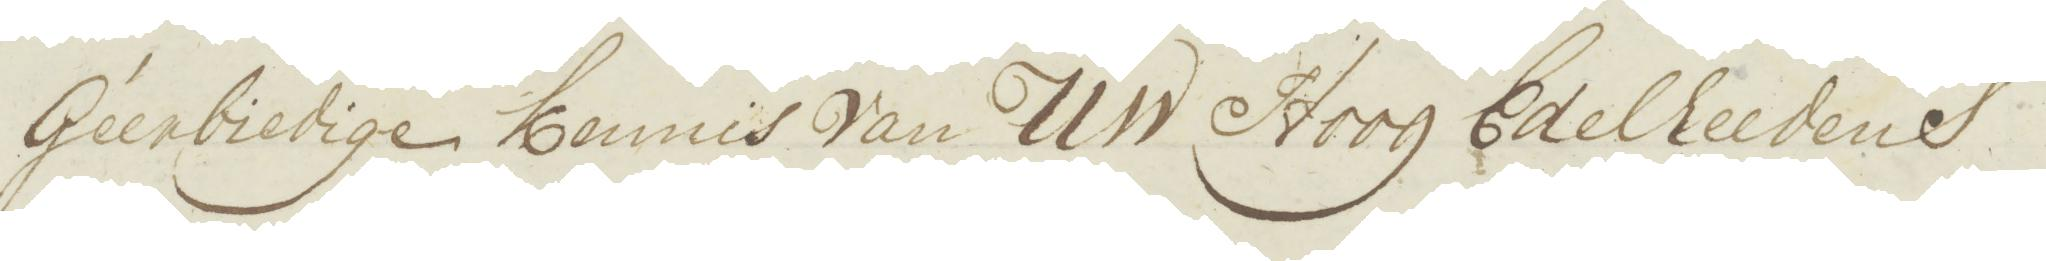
G'eerbiedige kennis van UW Hoog Edelheedens
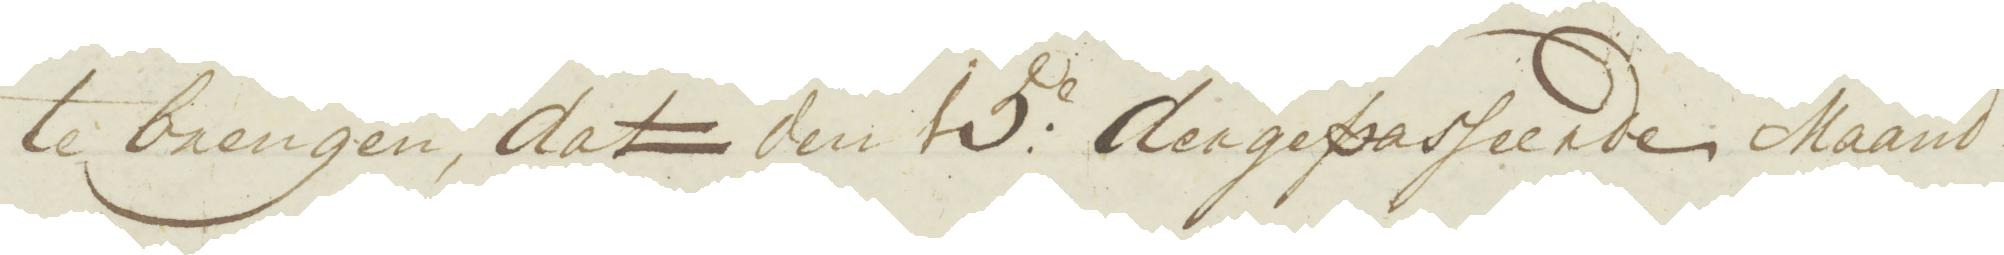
te brengen, dat den 15:' der gepasseerde Maand
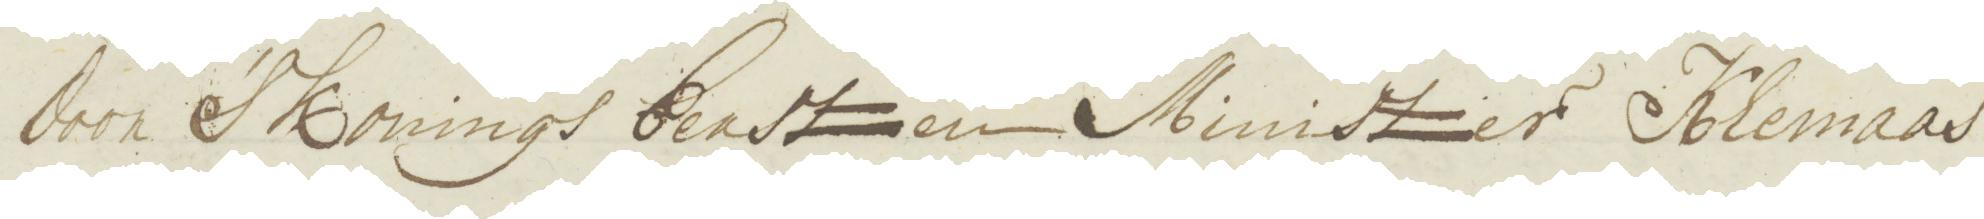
door 's konings Eersten Minister Khemaas
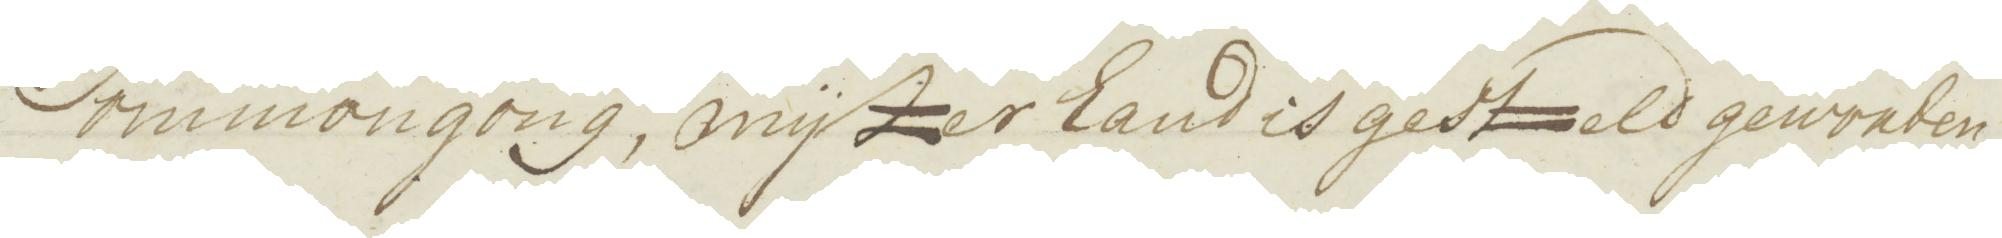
Tommongong, mijter hand is gesteld geworden,
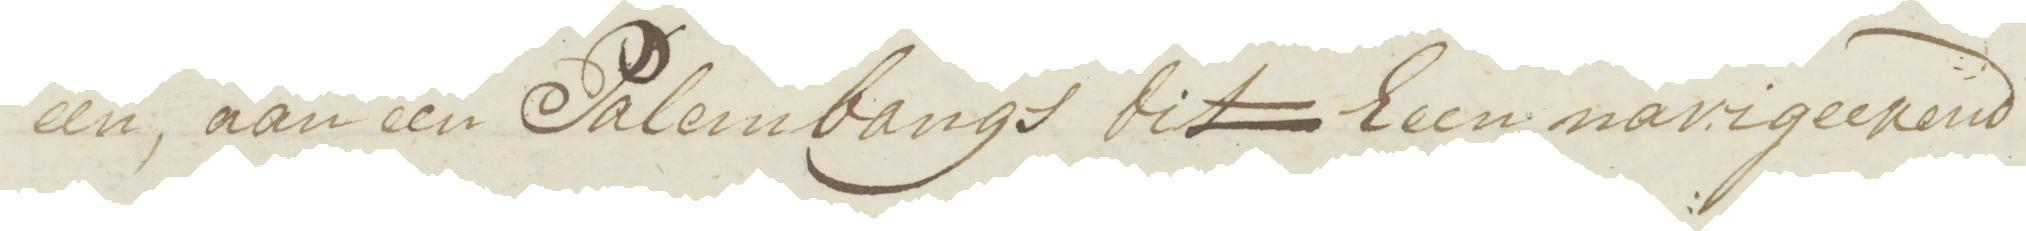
een, aan een Palembangs dit heen navigeerend
